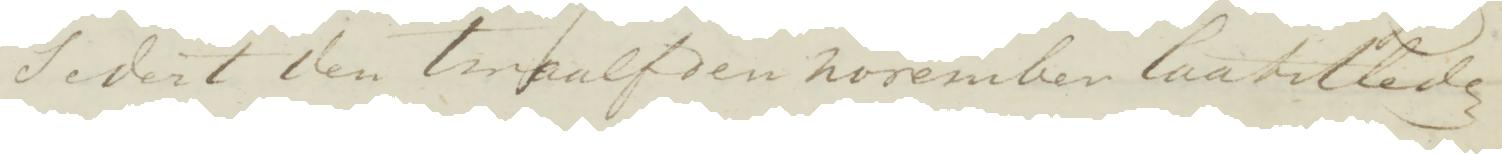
sedert den twaalfden november laatstleden
